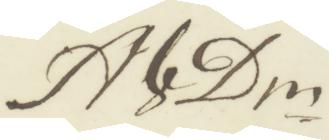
AvD jr
